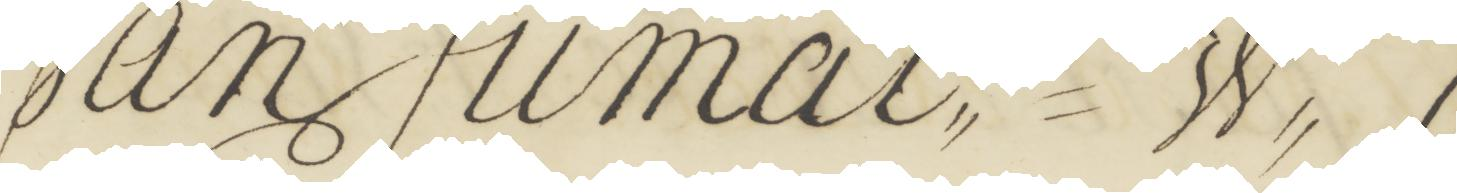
Van Sumat„s = W„t
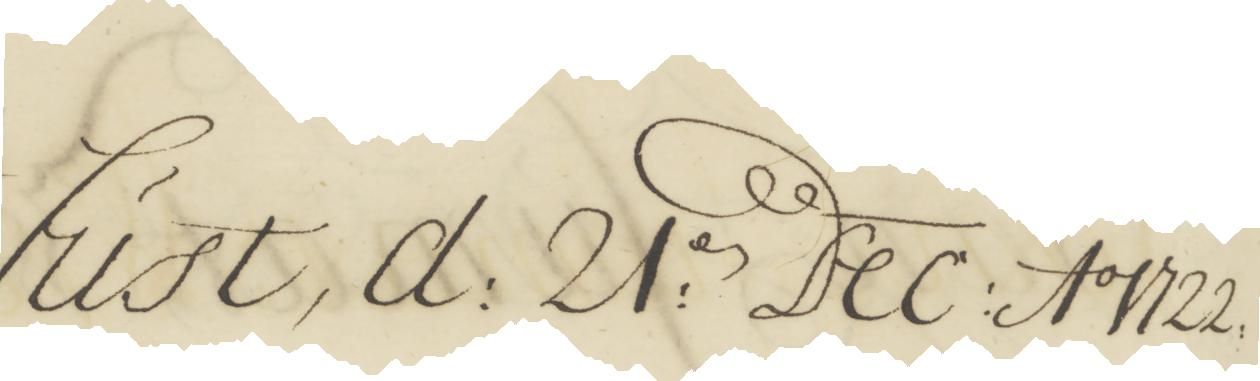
Cust, d: 21:en Dec: Ao1722:
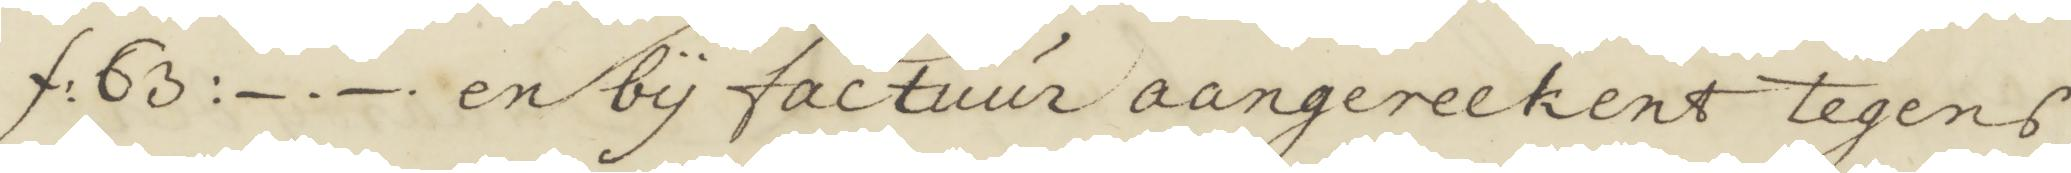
ƒ:63:—.—. en bij factuur aangereekent tegens
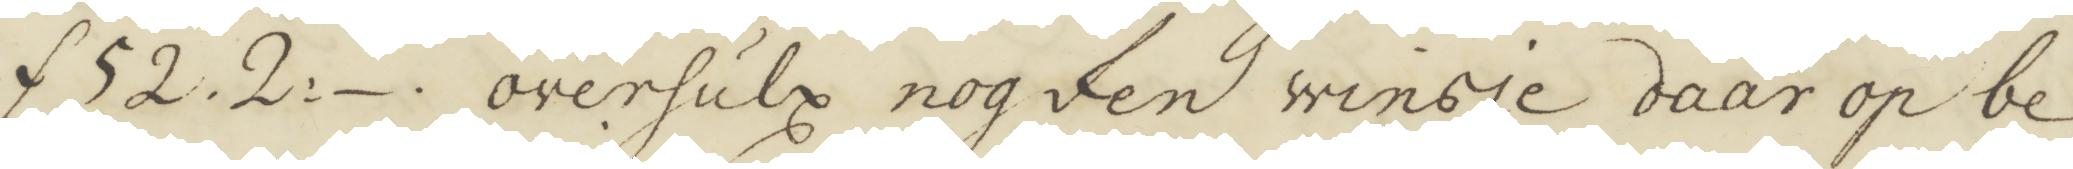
ƒ52:2:—. oversulx nog een winsje daar op be
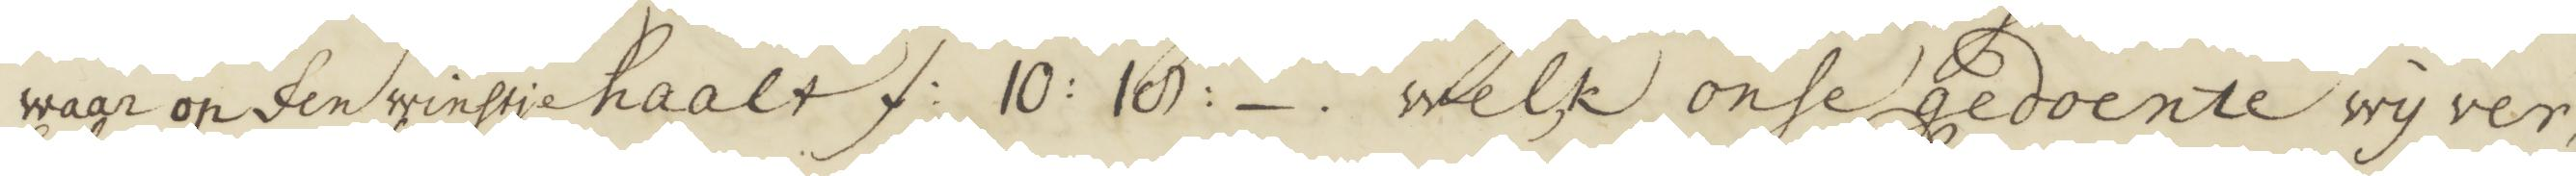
waar op een winstje haalt ƒ: 10: 18:—. welk onse gedoente wij ver„
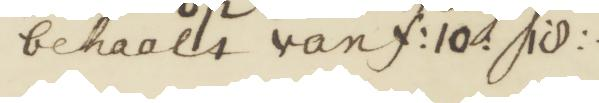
behaalt van ƒ:10: 18
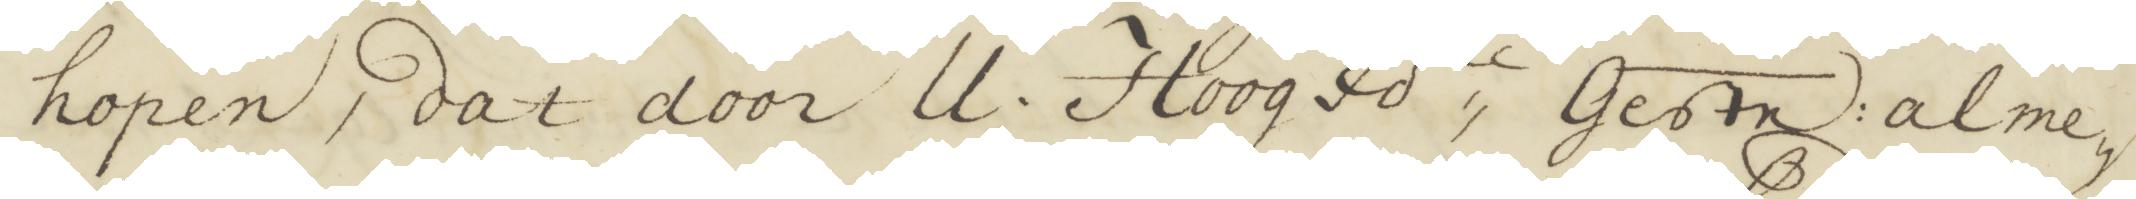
hopen, dat door U. Hoog Ed gestr: alme„
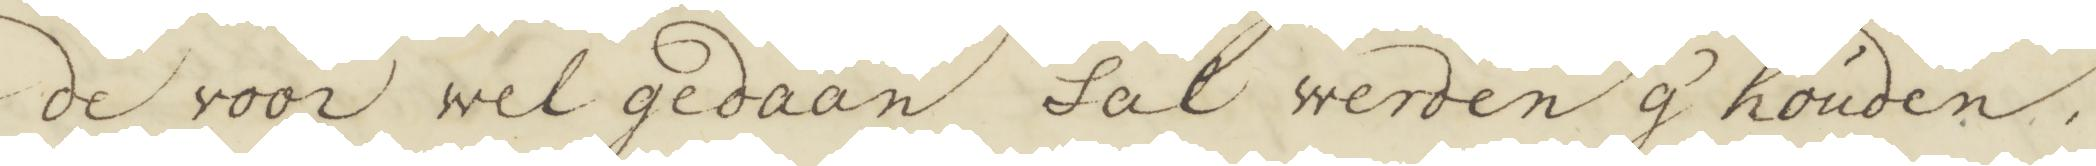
de voor wel gedaan sal werden g’houden.
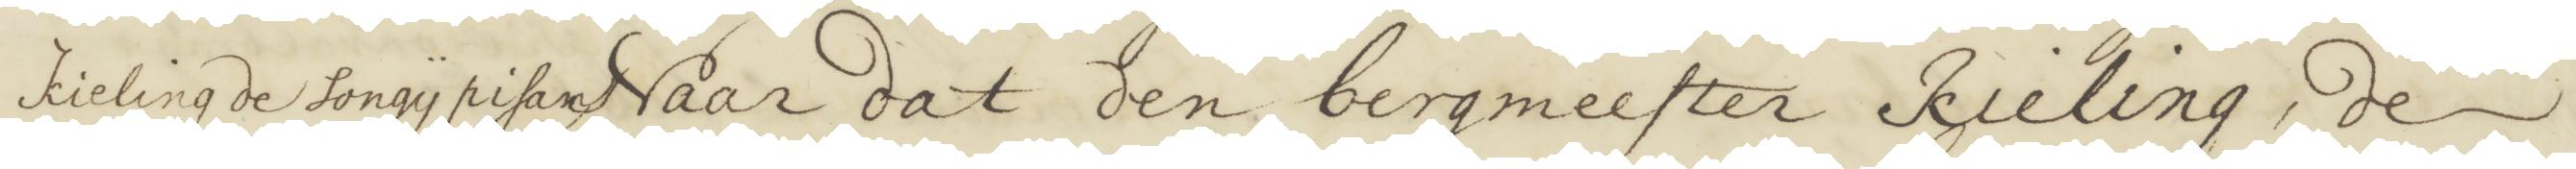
kieling de songij pisan Naar dat den bergmeester Kieling, de
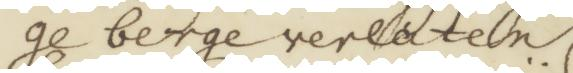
ge berge verlaten
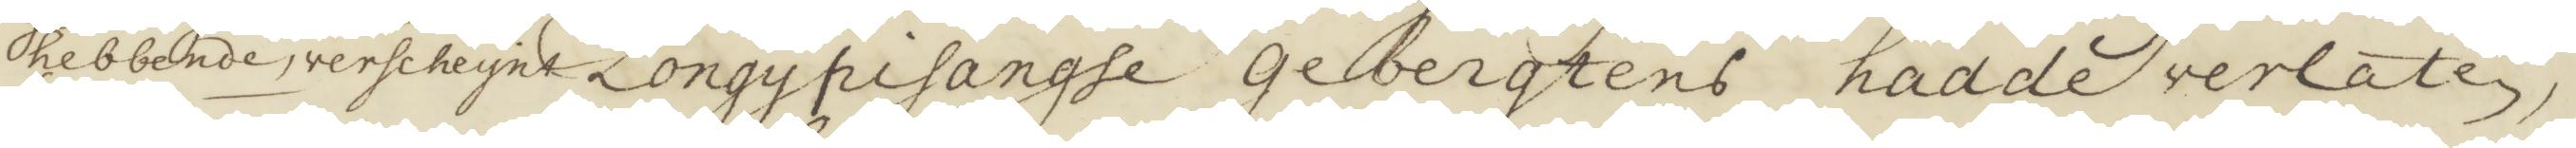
hebbende, verscheijnt Zongij pisangse gebergtens hadde verlaten,
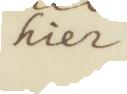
hier : —
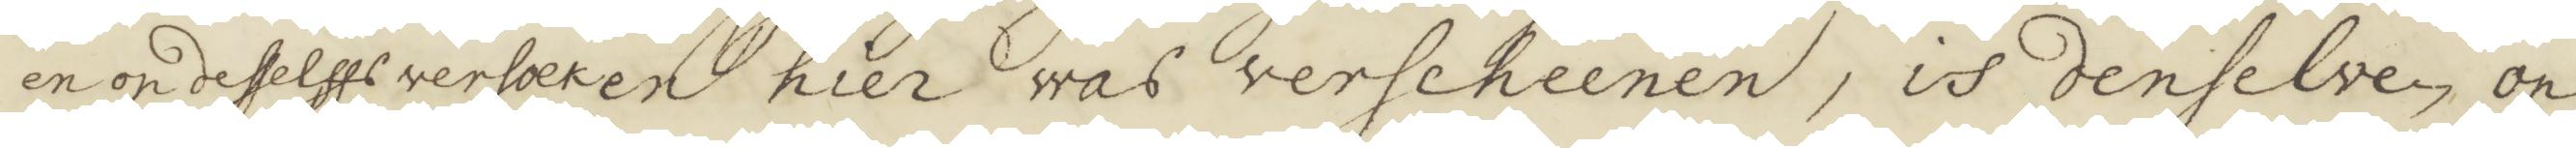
en op deselffs versoek en hier was verscheenen, is denselve, op
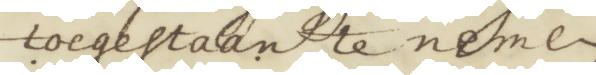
toegestaan te nemen
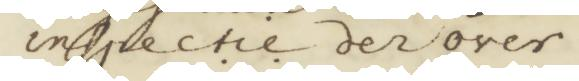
inspectie der over
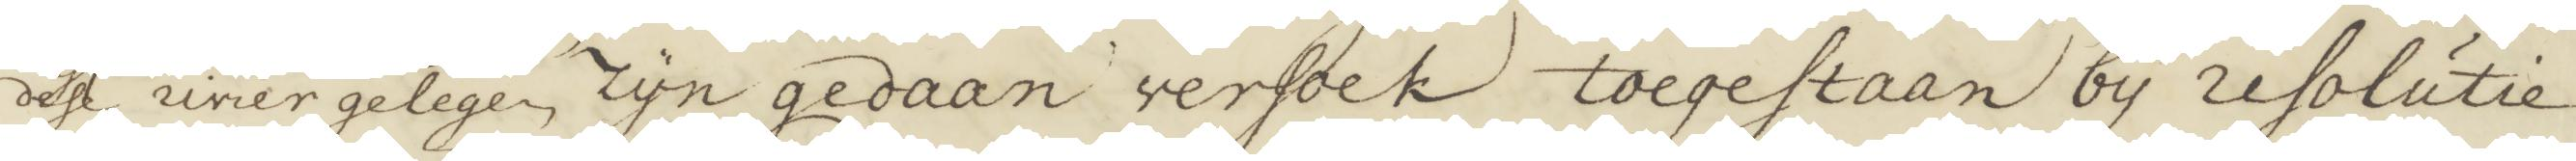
dese rivier gelegen zijn gedaan versoek toegestaan bij resolutie
